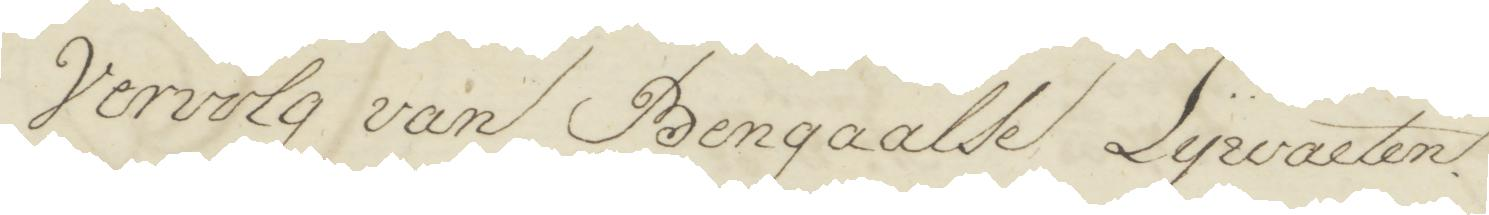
Vervolg van Bengaalse Lijvaeten.
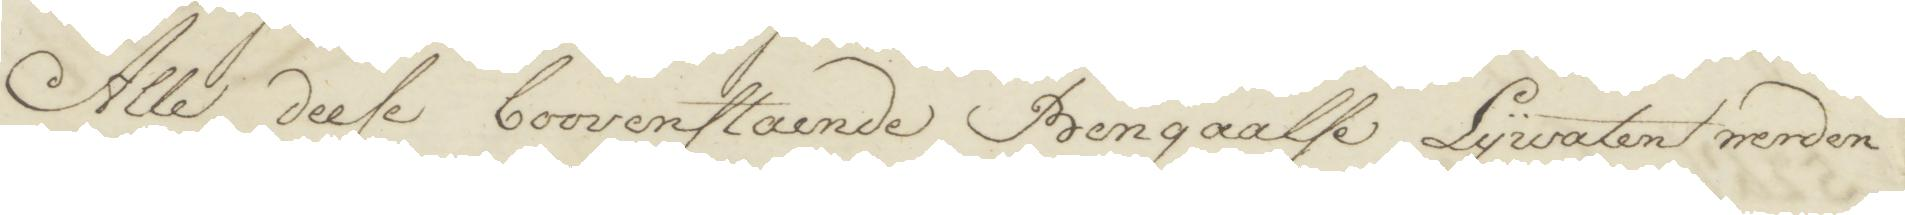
Alle deese boovenstaende Bengaalse Lijwaten werden
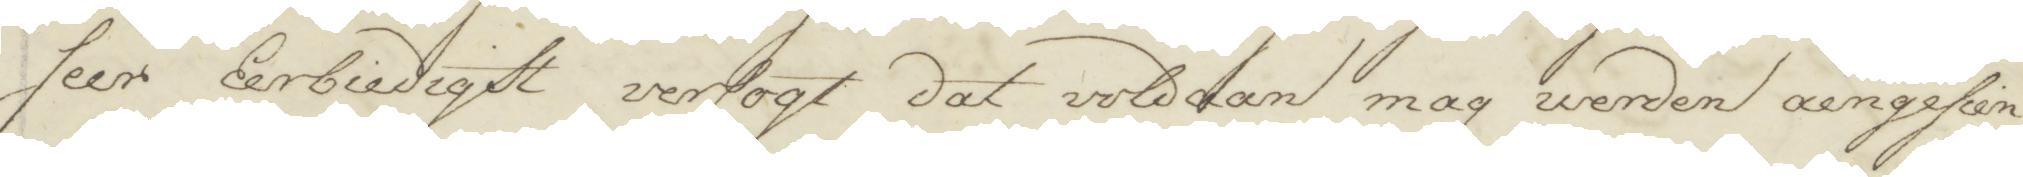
seer Eerbiedigst versogt dat voldaan mag werden aengesien
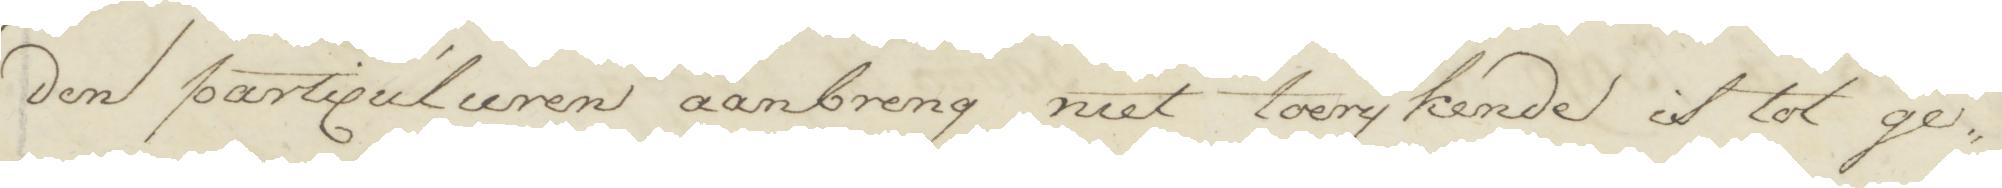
den particulieren aanbreng niet toerijkende is tot ge„
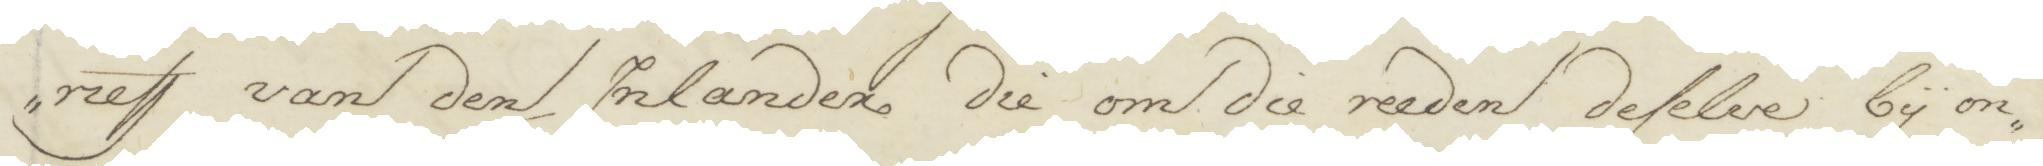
„rieff van den Jnlander die om die reeden deselve bij on„
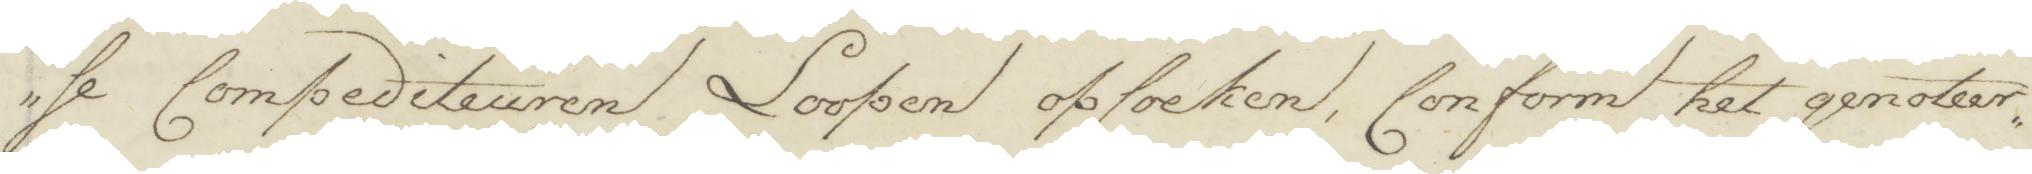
„se Compediteuren Loopen opsoeken, Conform het genoteer„
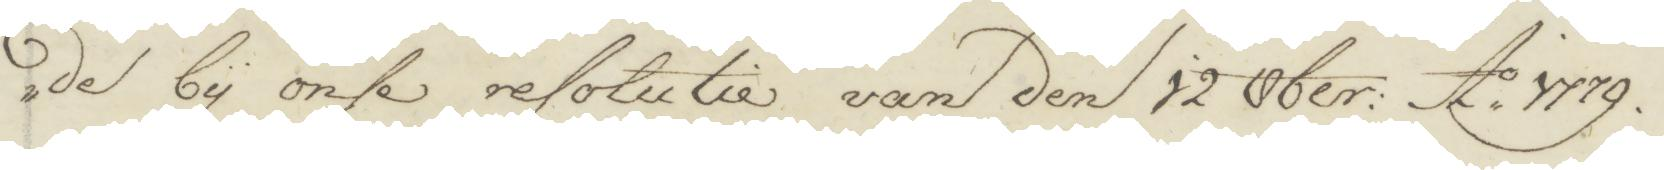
„de bij onse resolutie van den 12 8ber: A„o 1779.
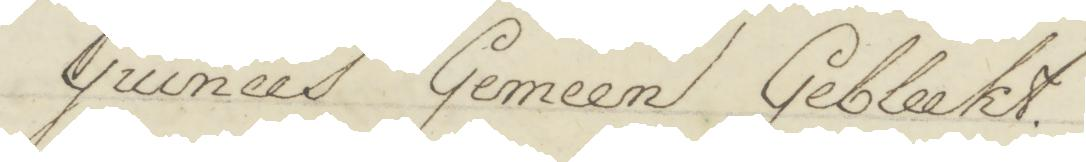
Guinees Gemeen Gebleekt.
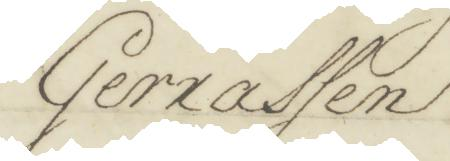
Gerrassen
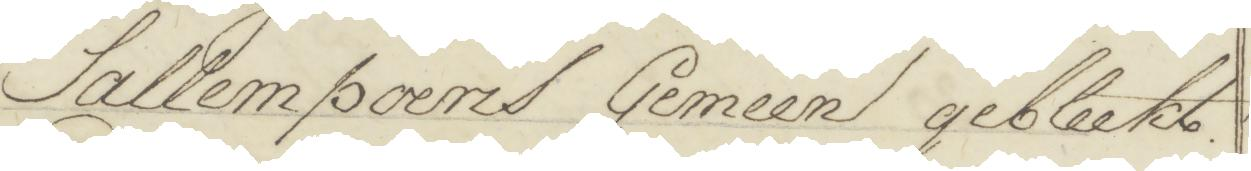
Sallempoeris Gemeen gebleekt.
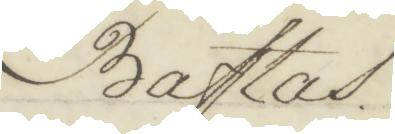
Bafftas.
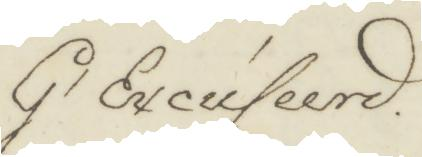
G' Excuseerd.
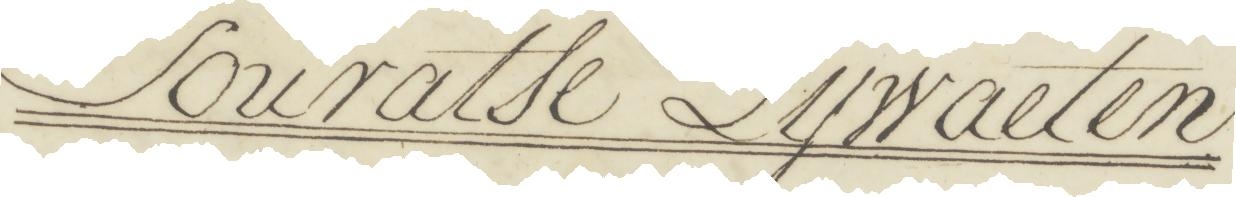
Souratse Lijwaeten
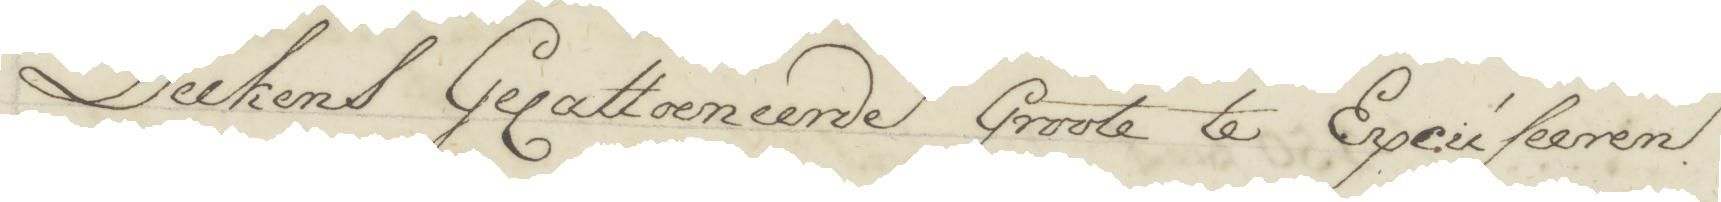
Deekens Gecattoeneerde Groote te Excuseeren
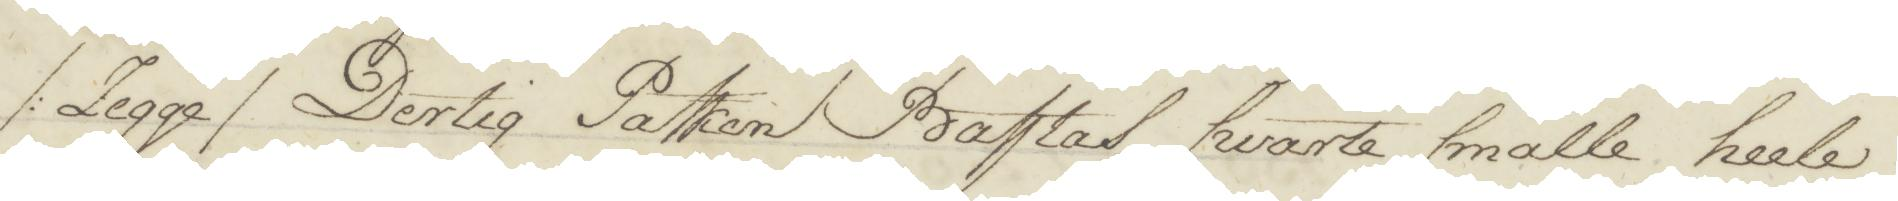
/:zegge/ Dertig Pakken Bafftas swarte smalle heele
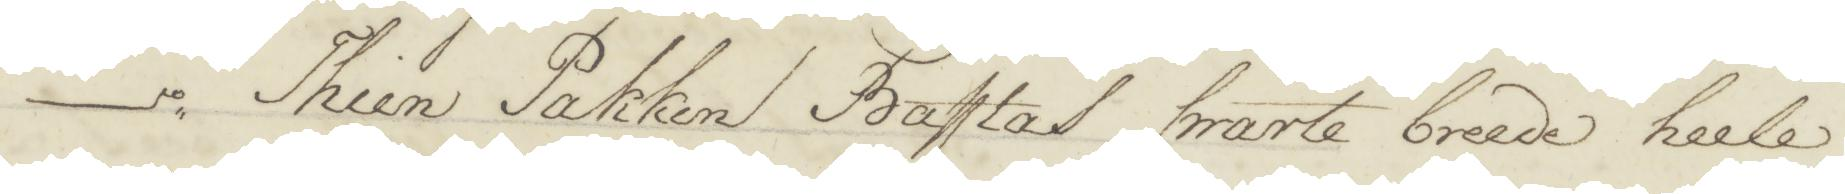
_:o Thien Pakken Bafftas swarte breede heele
